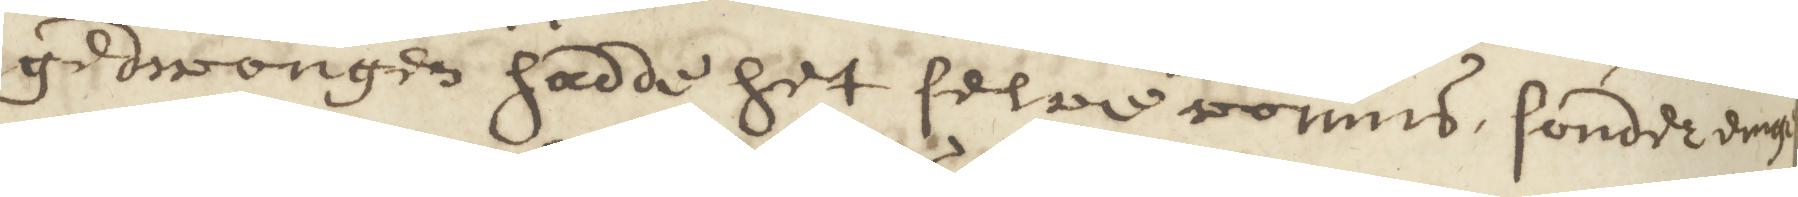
gedwongen hadde het selve vonnis, sonder enige
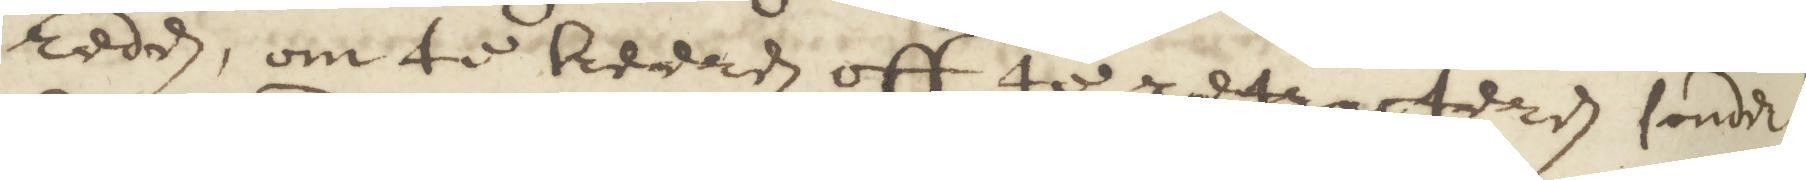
reden, om te keeren off te retracteren sonder
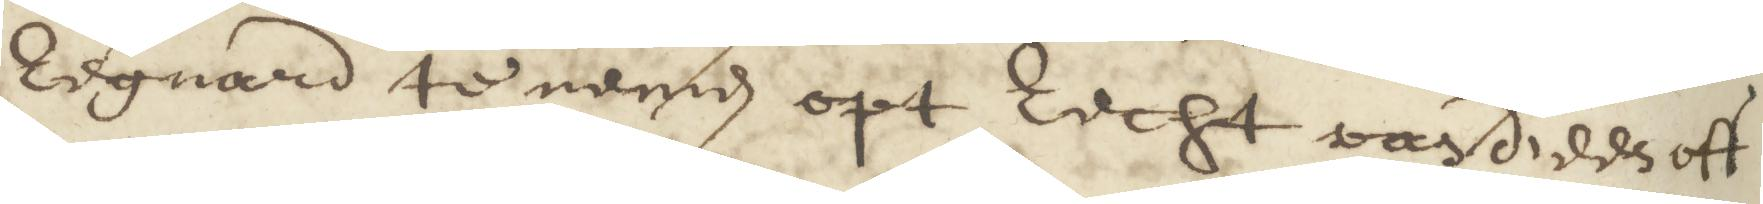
reguard te nemen opt recht van d'een off
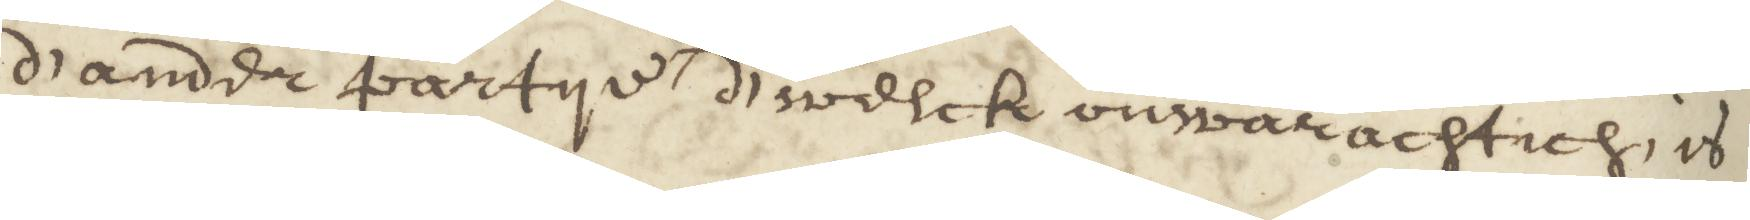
d’ander partye d'welck onwarachtich, is
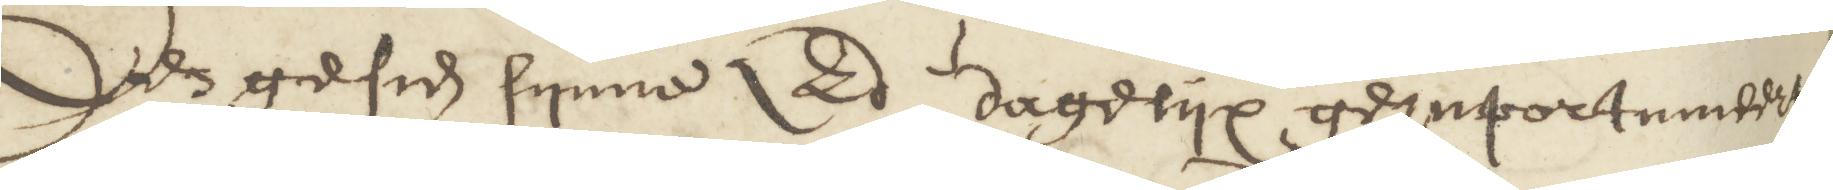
Aengesien synne Ed' dagelijx gejnportimeert
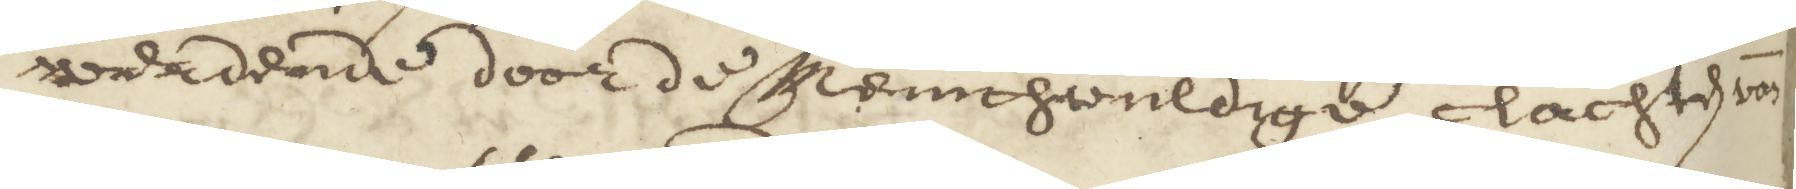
werdende door de menichvuldige clachten van
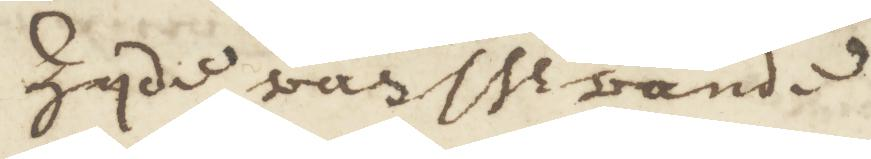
zyde van ssr vande
